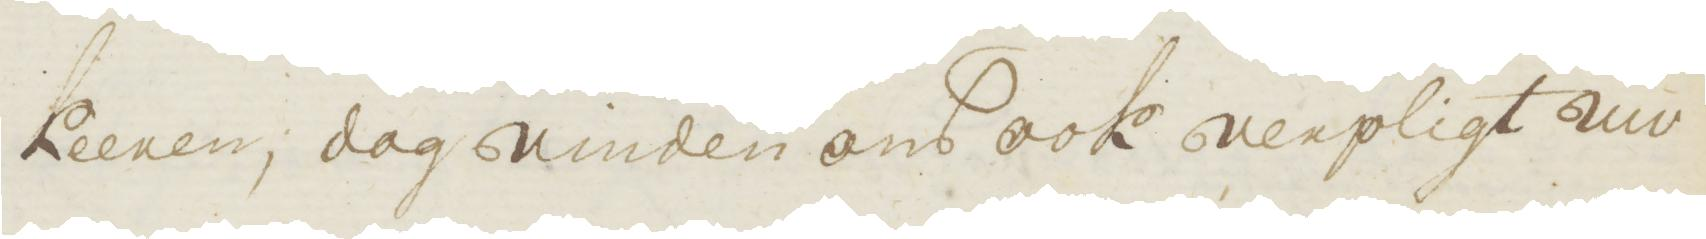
keeren, dog vinden ons ook verpligt uw
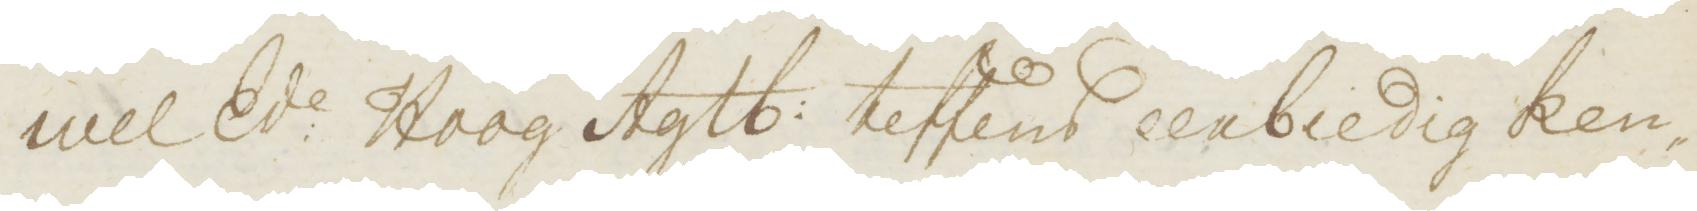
wel Ed:e Hoog Agtb: teffens eerbiedig ken„
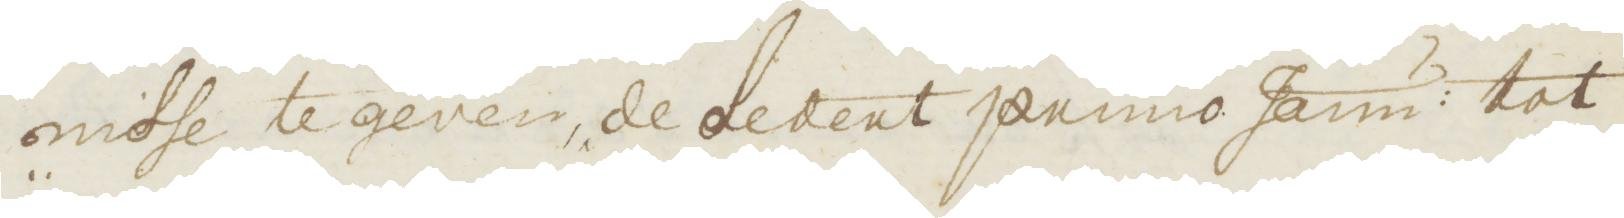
„nisse te geven, de sedert primo Janu:i tot
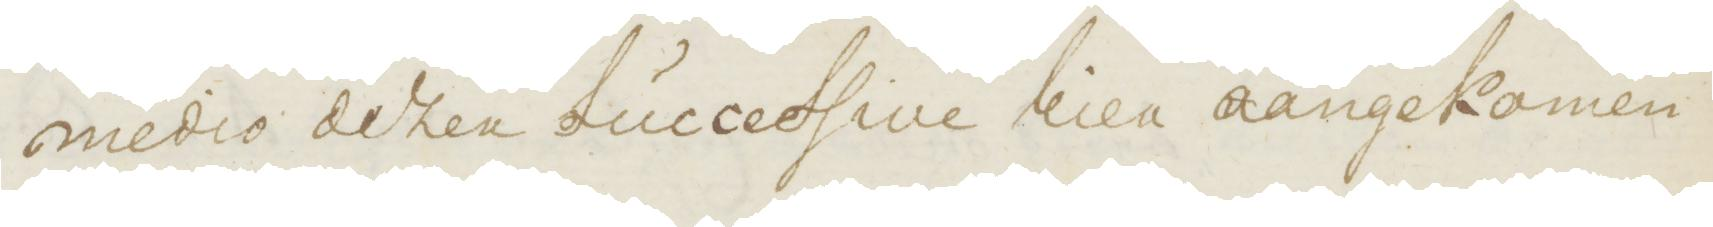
medio dezen successive hier aangekomen
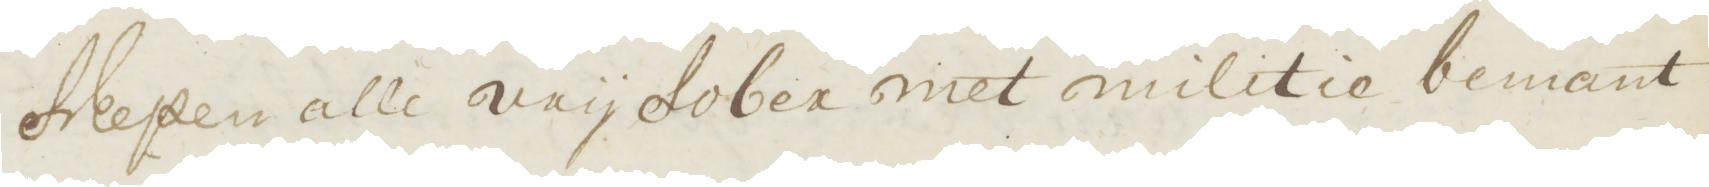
schepen alle vrij sober met militie bemant
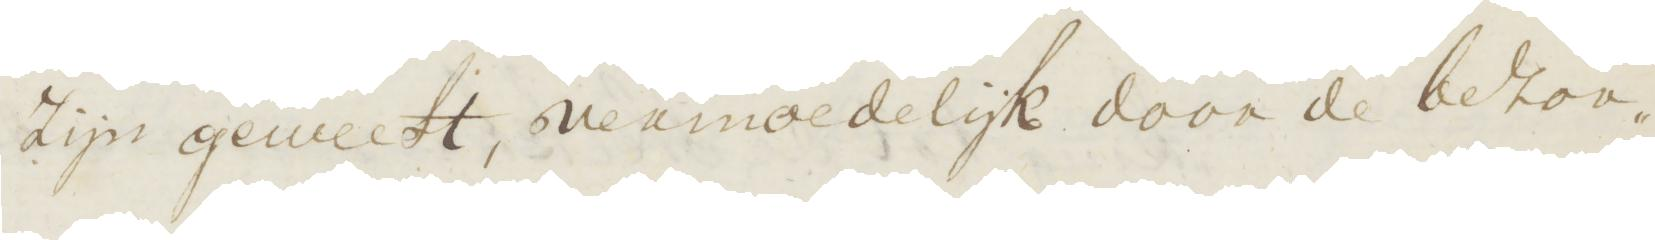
zijn geweest, vermoedelijk door de bezor„
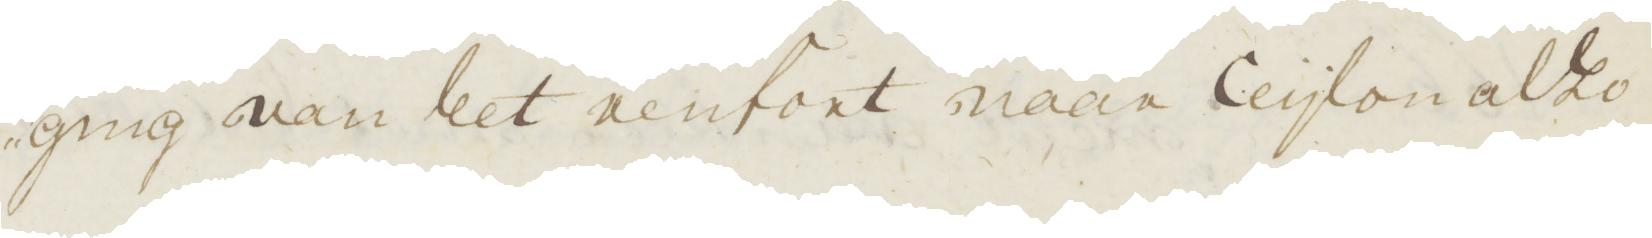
„ging van het renfort naar Ceijlon alzo
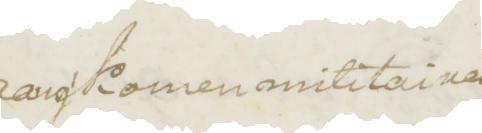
aang'komen militaire
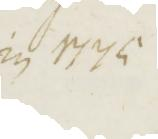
in 1775
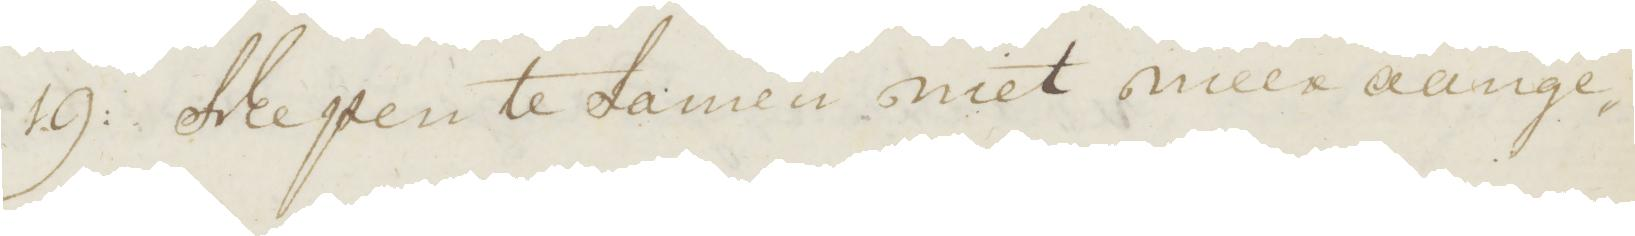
19: Schepen te Samen niet meer aange„
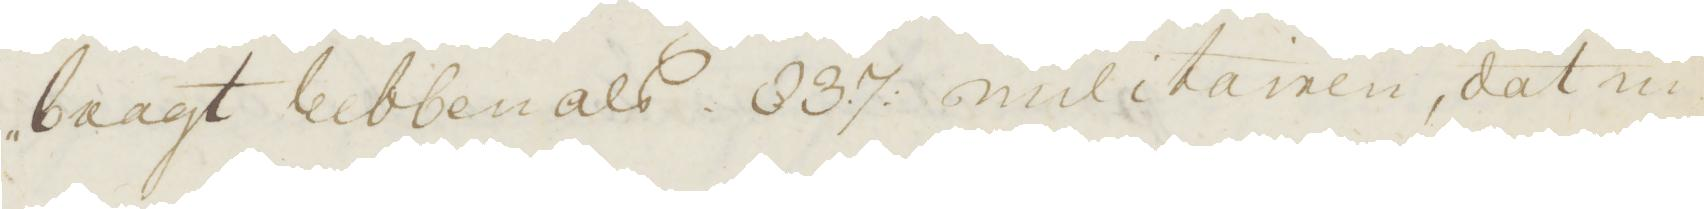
„bragt hebben als 837: militairen, dat in
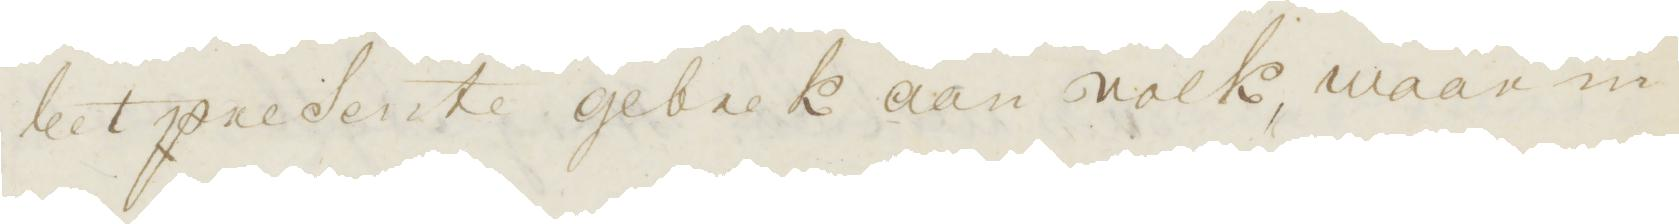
het presente gebrek aan volk, waar in
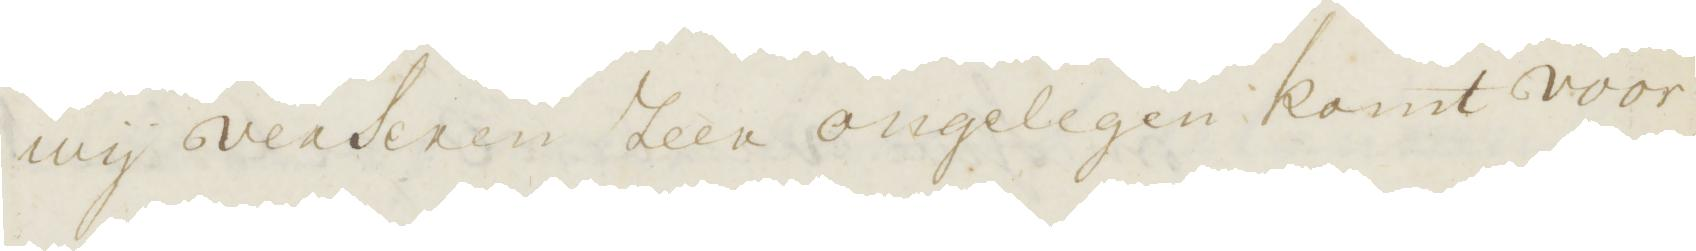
wij verseren Zeer ongelegen komt voor
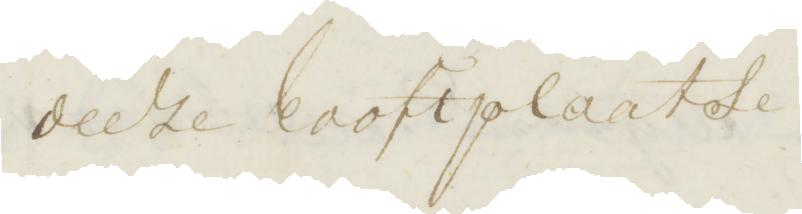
deeze hooftplaatse
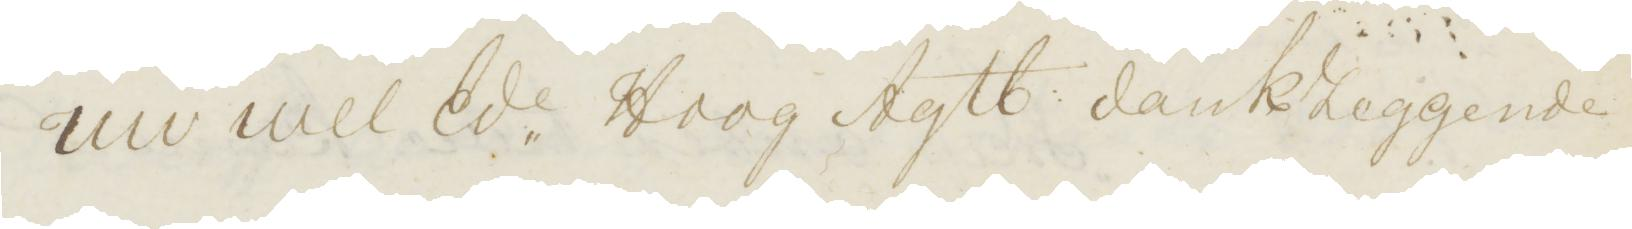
uw wel Ed„e Hoog Agtb: dankzeggende
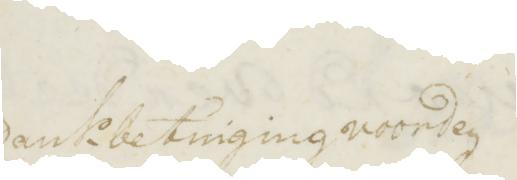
ank betuiging voorden
